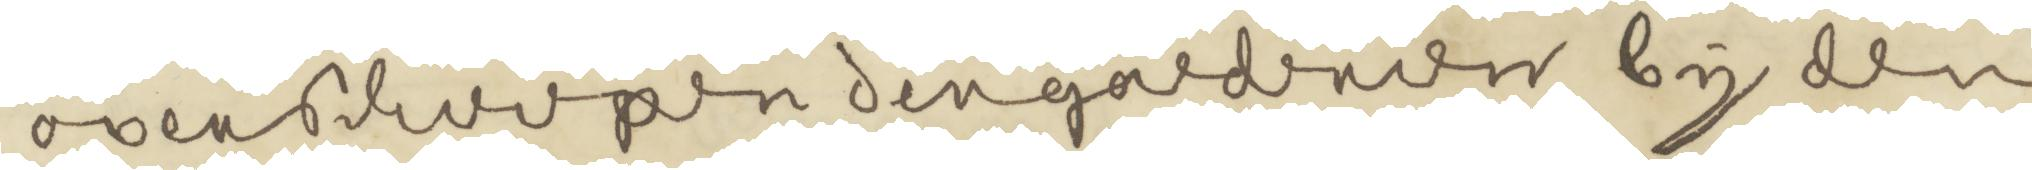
overscheepen der goederen bij den
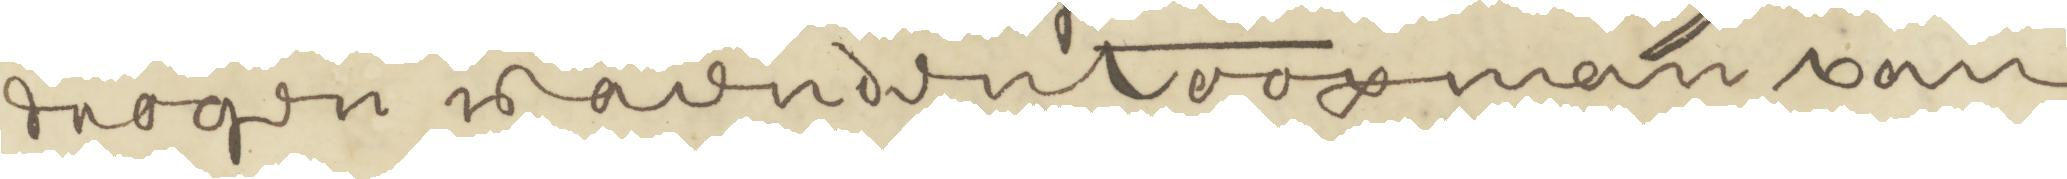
drogen is aen den Coopman van
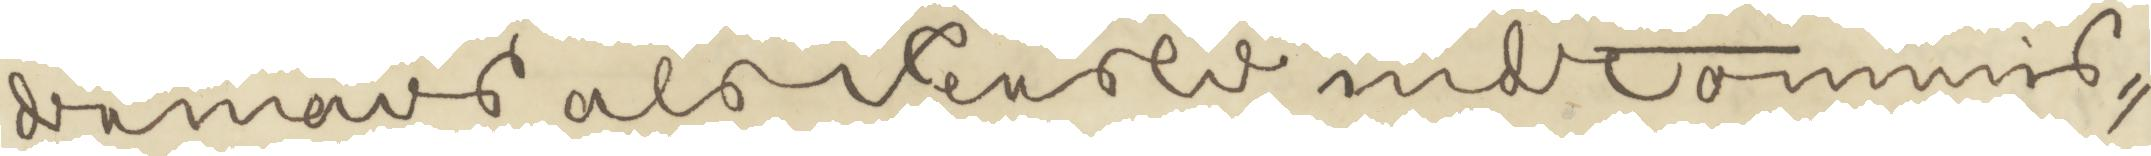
der maes als Eerste inde Commis„
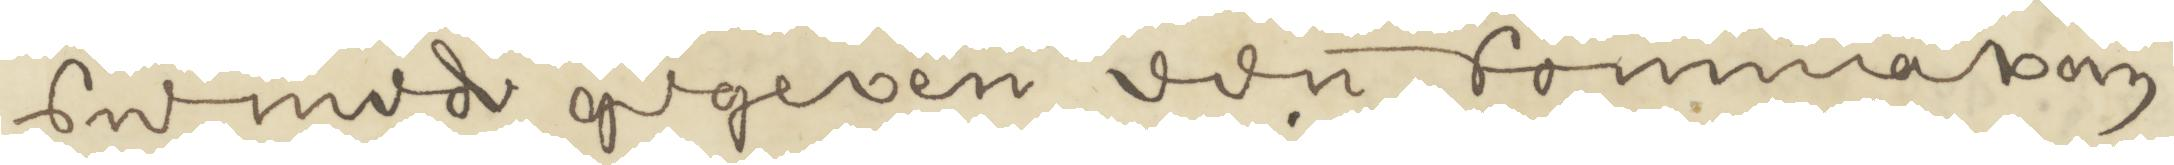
sie mede gegeven een somma van
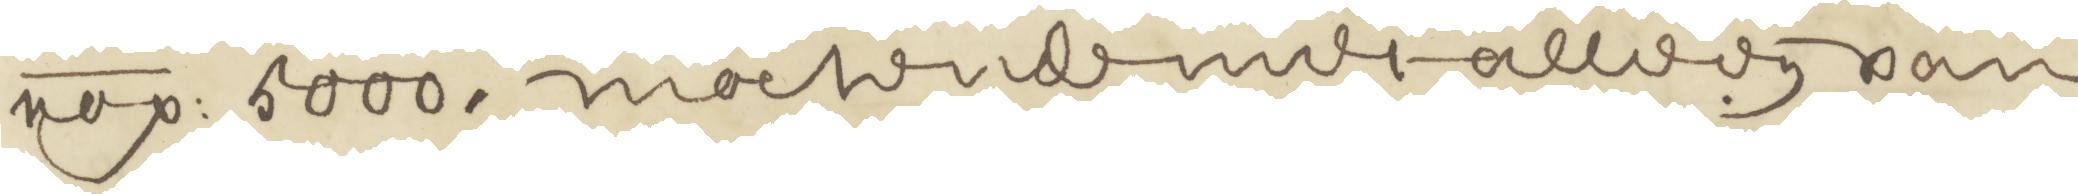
rop: 5000, moetende niet alleen van
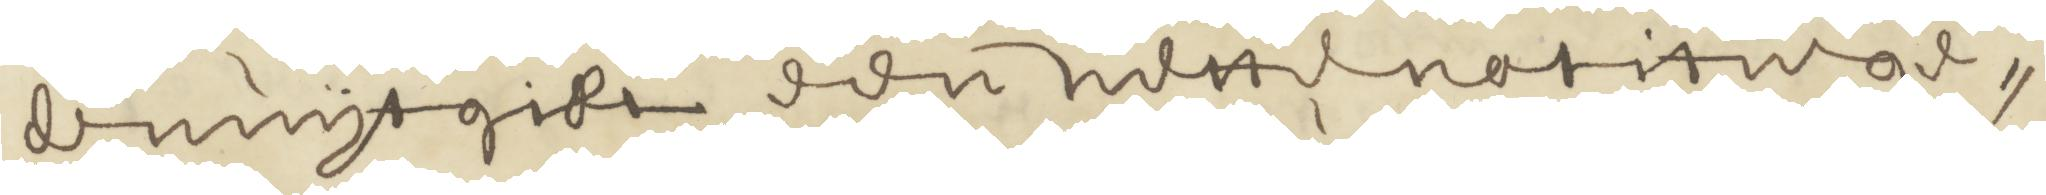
den uijtgift een nette notitie ge„
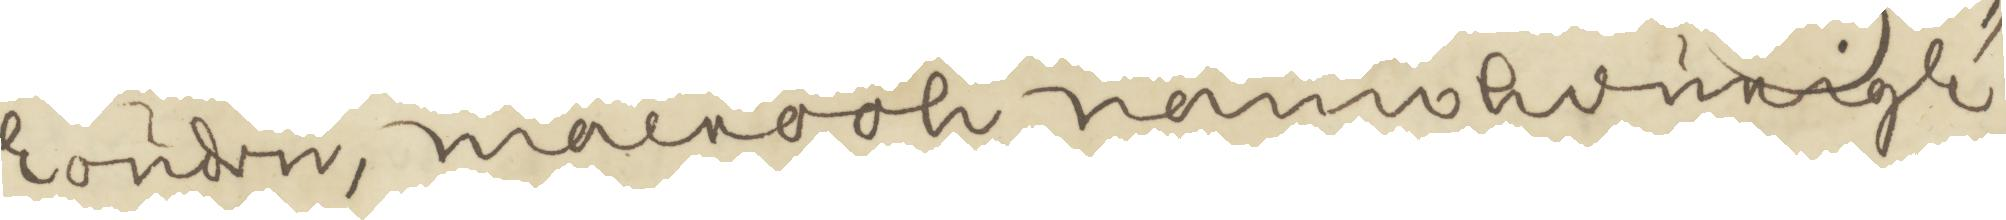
houden, maer ook nauwkeurigh
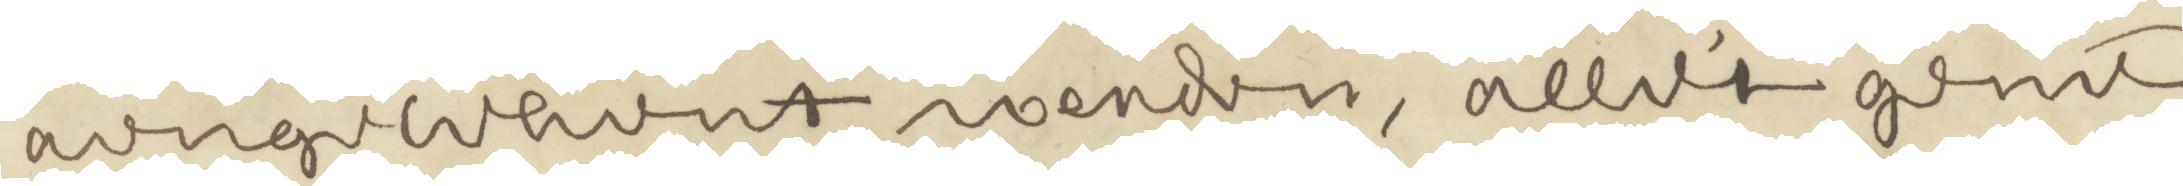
aengetekent werden, alle 't gene
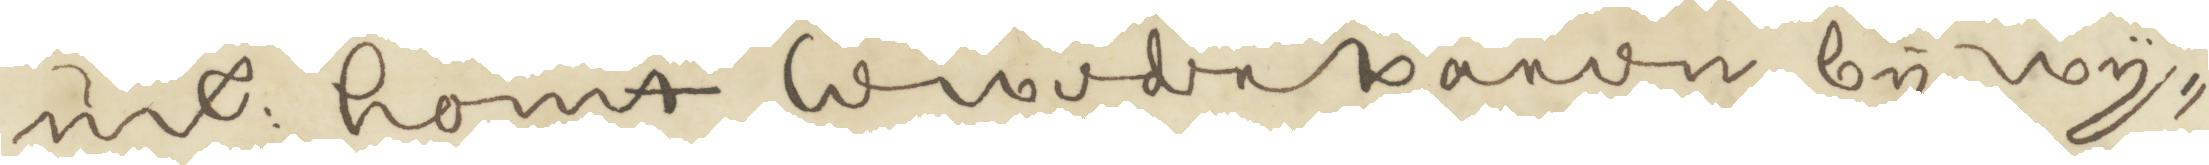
uE: komt te weder varen, bij wij„
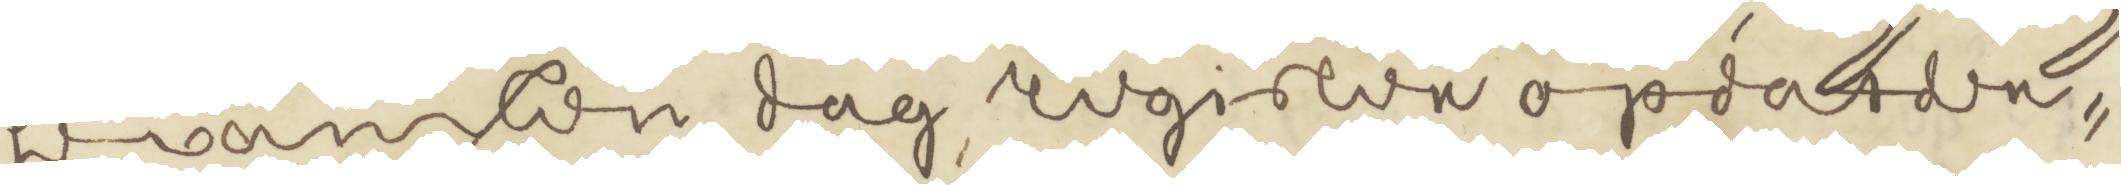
se van Een dag register op dat der„
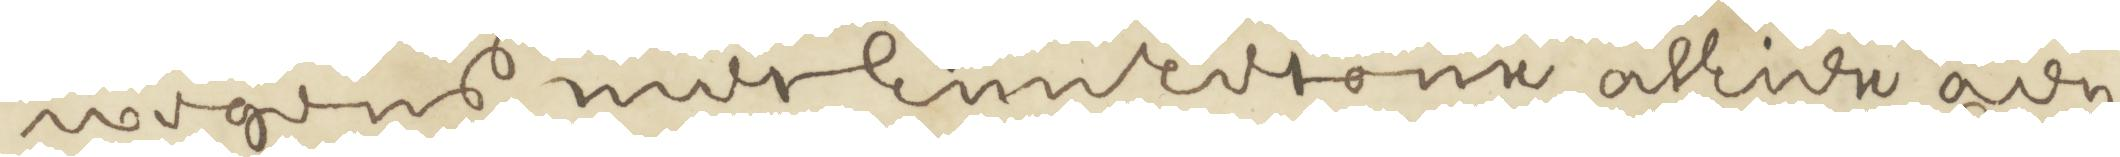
wegens met hun retour alhier aen
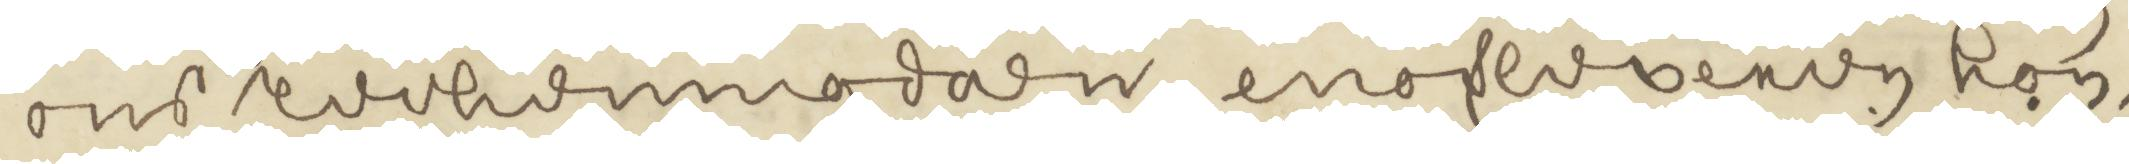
ons reekening doen, en overleveren kon
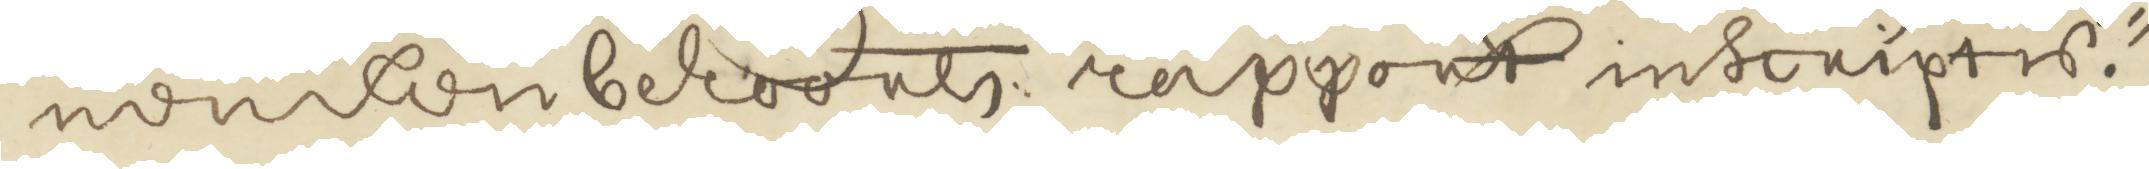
nen Een behoorlijk rapport inscriptis.
